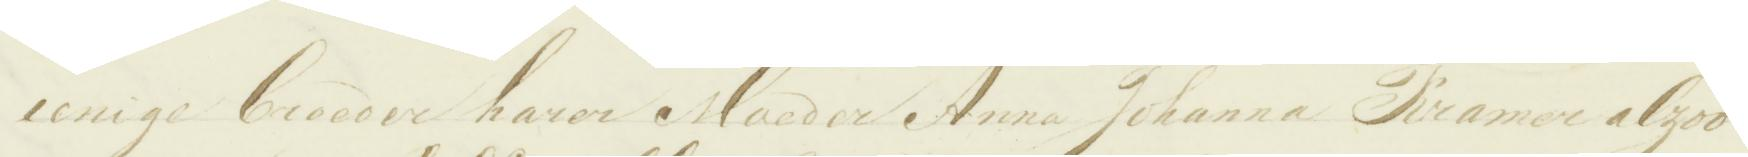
eenige broeder harer Moeder Anna Johanna Kramer alzoo
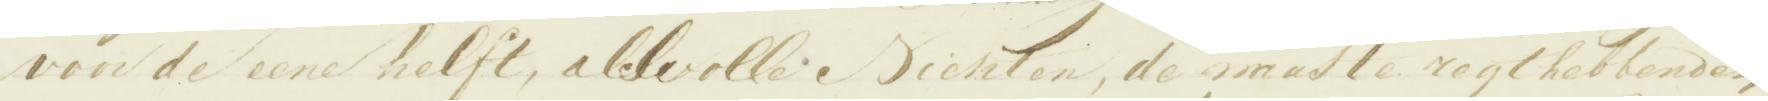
voor de eene helft, als volle Nichten, de naaste regthebbenden
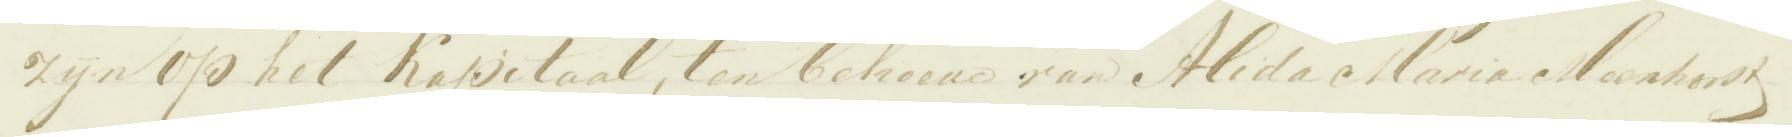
zijn op het Kapitaal, ten behoeve van Alida Maria Meenhorst
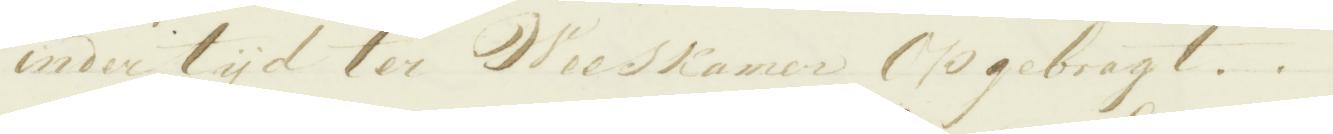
inder tijd ter Weeskamer Opgebragt . .
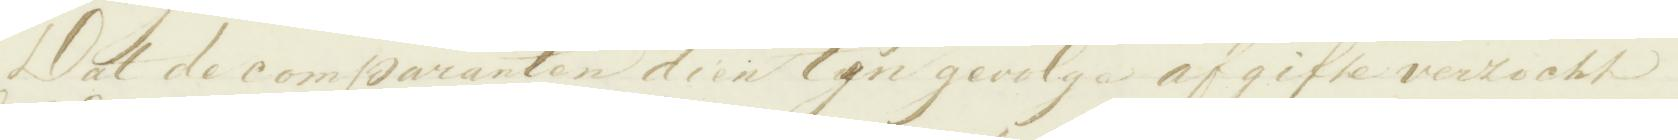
Dat de comparanten dien ten gevolge afgifte verzocht
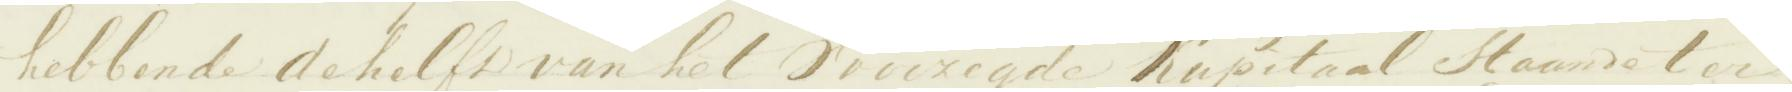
hebbende de helft van het voorzegde Kapitaal staande ter
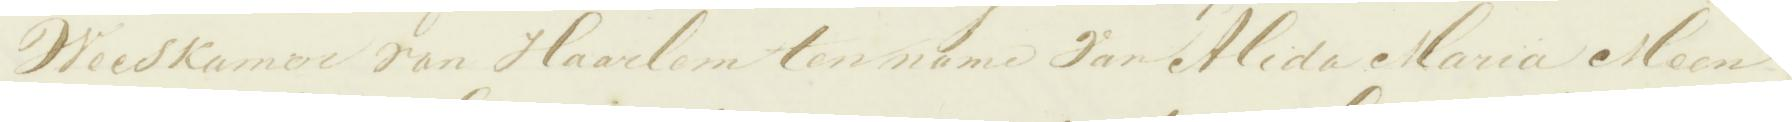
Weeskamer van Haarlem ten name Van Alida Maria Meen
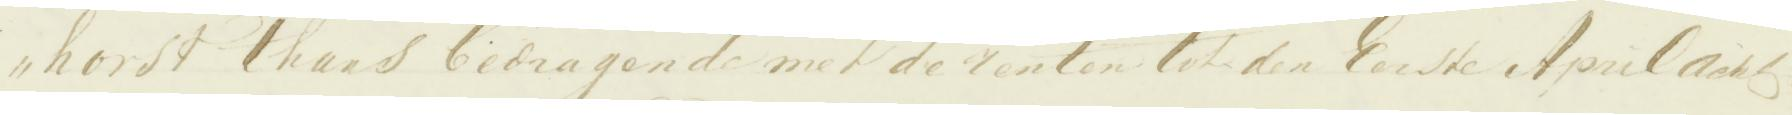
„horst thans bedragende met de renten tot den Eerste April Acht
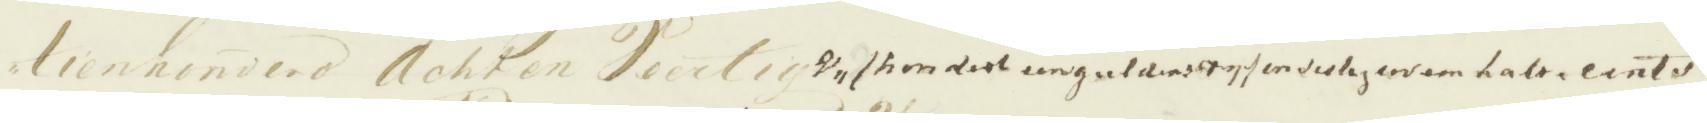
„tienhonderd Acht en Veertig vyfhonderd een guldens vyf en sestig een en halve cents
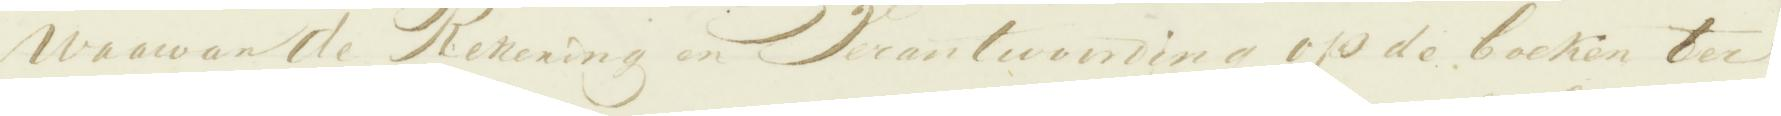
Waarvan de Rekening en Verantwoording op de boeken ter
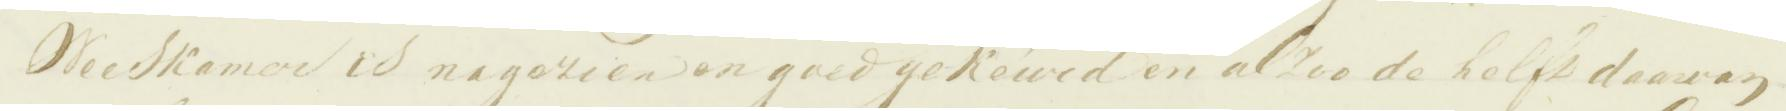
Weeskamer is nagezien en goedgekeurd en alzoo de helft daarvan
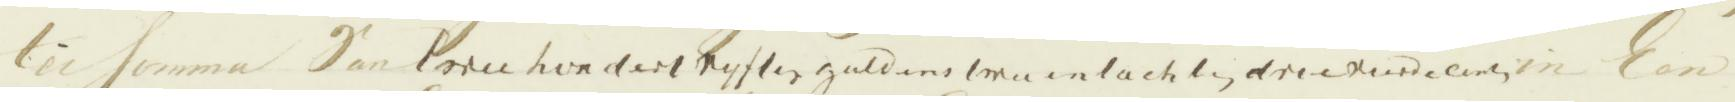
ter somma Van twee honderd vyftig guldens twee en tachtig drie vierde Cents in Een
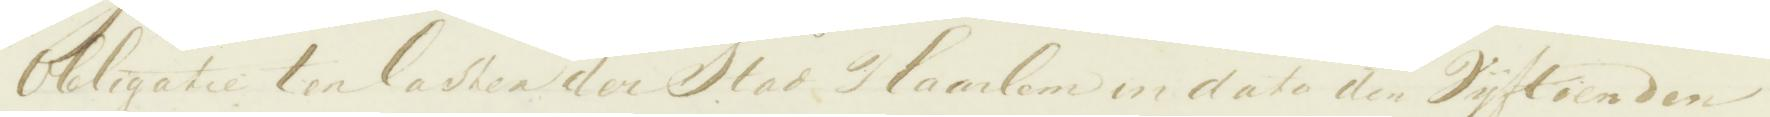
Obligatie ten lasten der Stad Haarlem in dato den Vijftien den
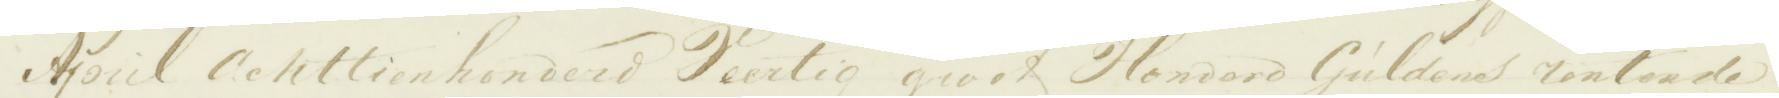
April Achttienhonderd Veertig groot Honderd Guldens rentende
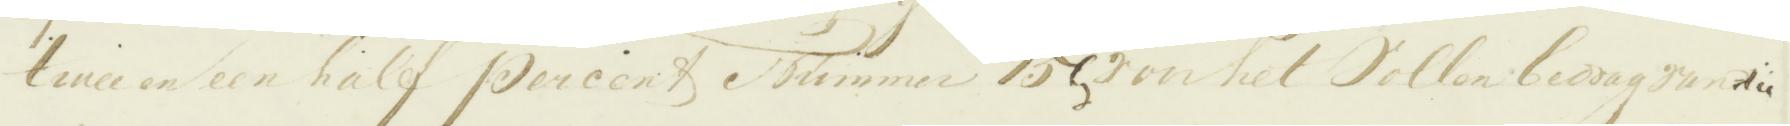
twee en een half percent Nummer 150, voor het Vollen bedrag van die
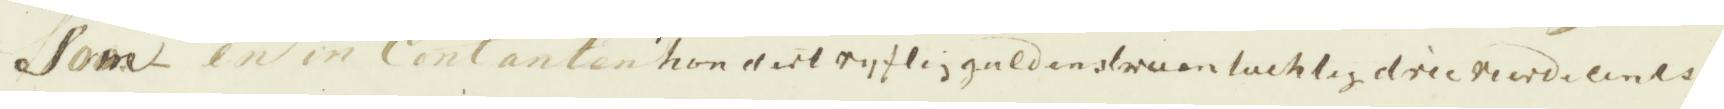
Som en in Contanten honderd vyftig guldens twee en tachtig drie vierde cents
